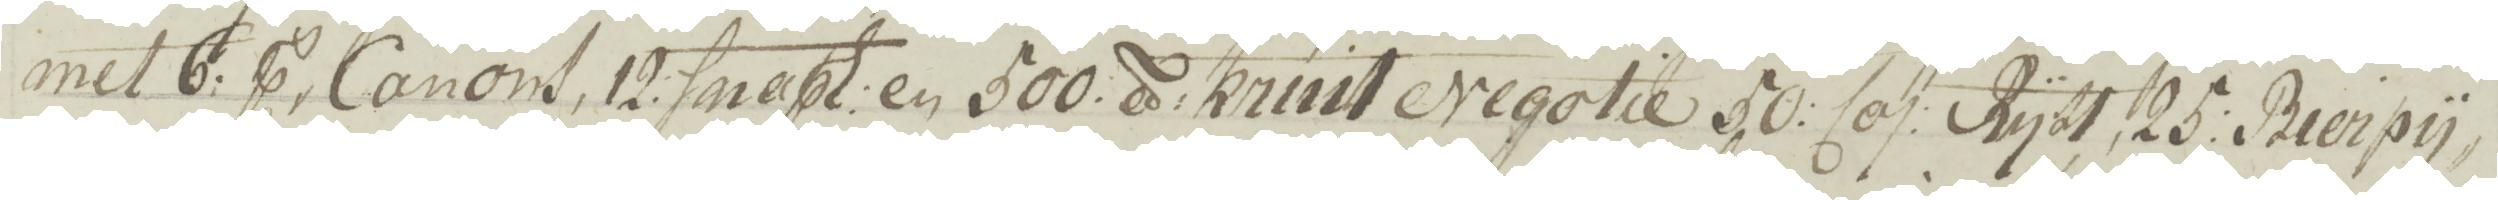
met 6: p„s Canons, 12: snaph: en 500. lb: kruit Negotie 50: Cop: Rijst, 25: Bierpij„
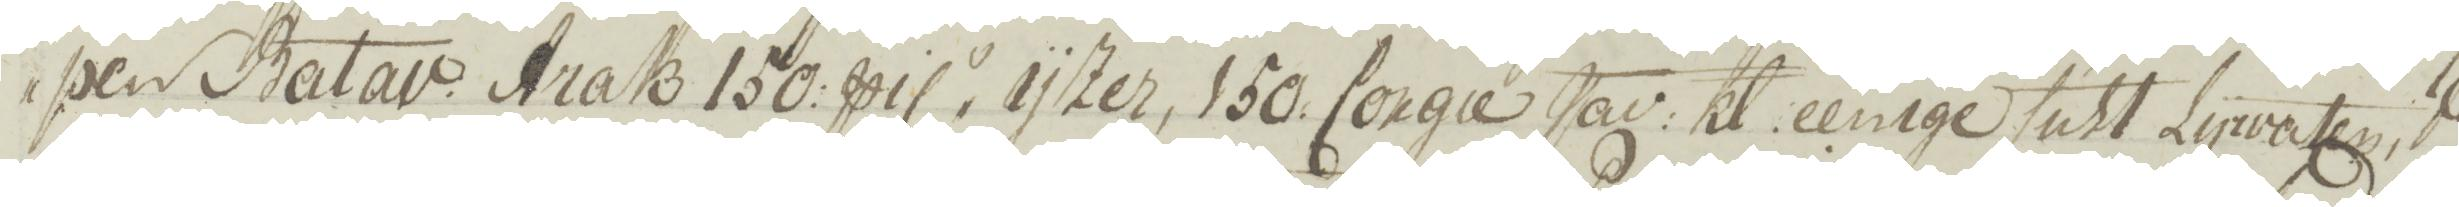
„pen Batav: Arak 150: pic„s ijzer, 150: Corgie Jav: kl: eenige Cust Lijwaten, d
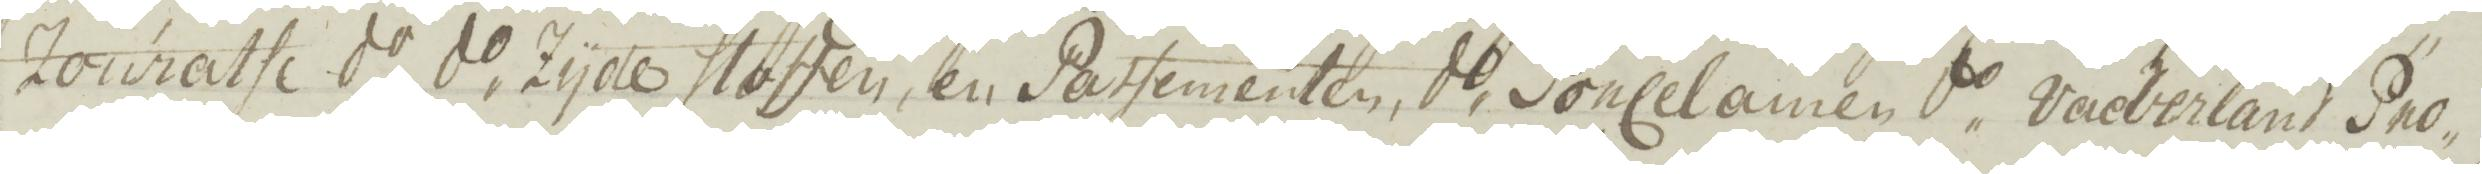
zouratse d„o d„o Zijde stoffen, en Passementen, d„o Porcelainen d„o vaderland Pro„
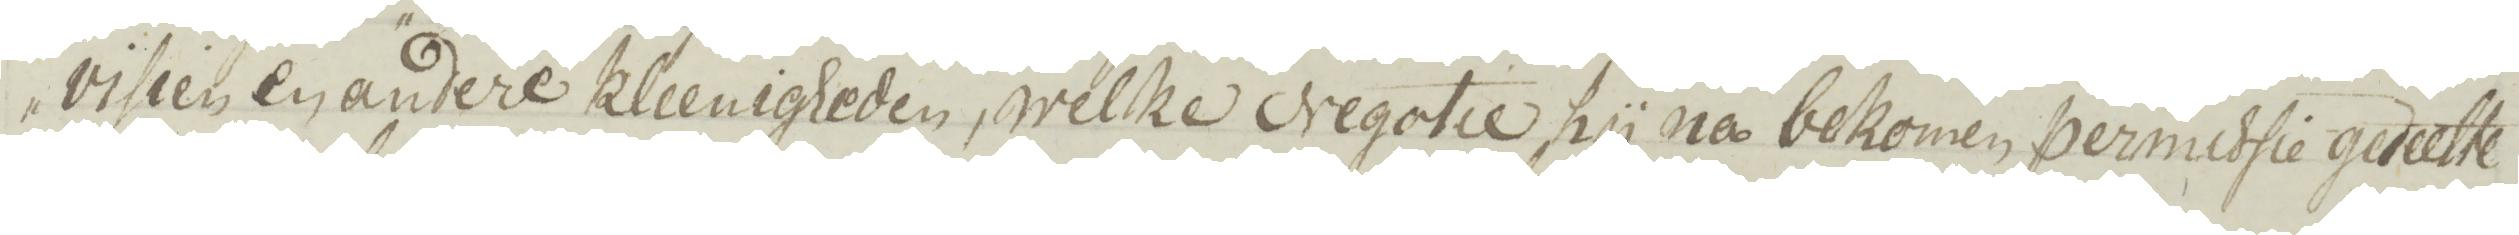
„visien en andere kleenigheden, welke Negotie hij na bekomen permissie gedeelte
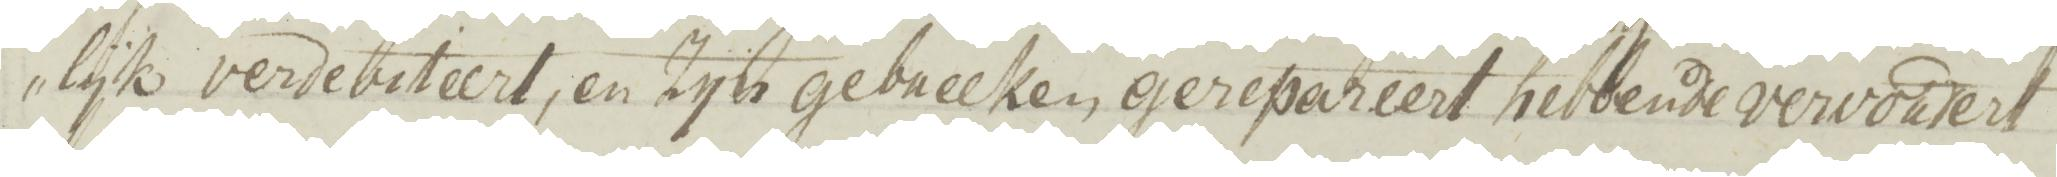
„lijk verdebiteert, en zijn gebreeken gerepareert hebbende vervordert
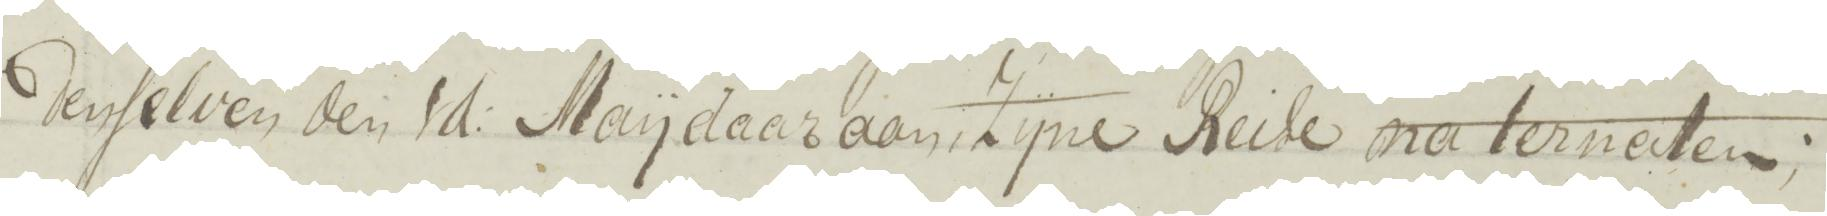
denselven den 14: Maij daar aan, zijne Reise na ternaten;
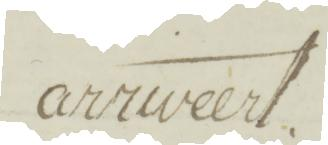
arriveert.
